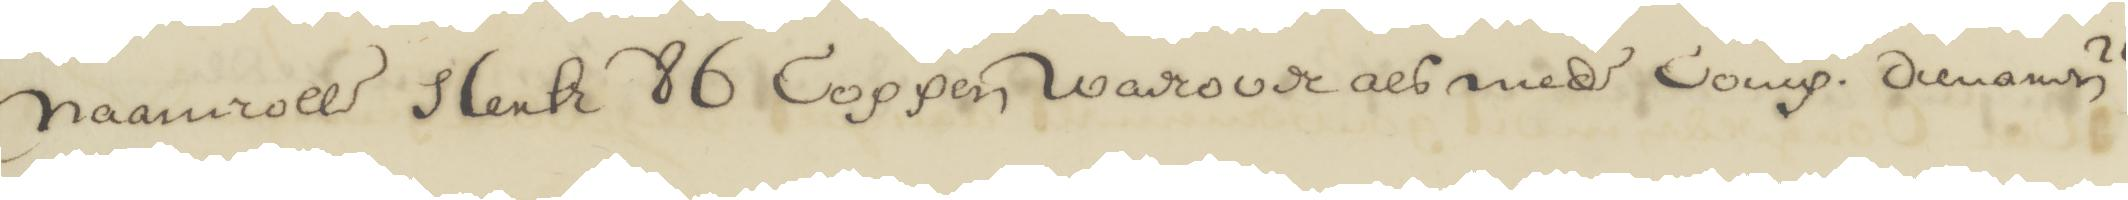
naamrolle sterk 86 Coppen waerover als mede Comp.s dienaren
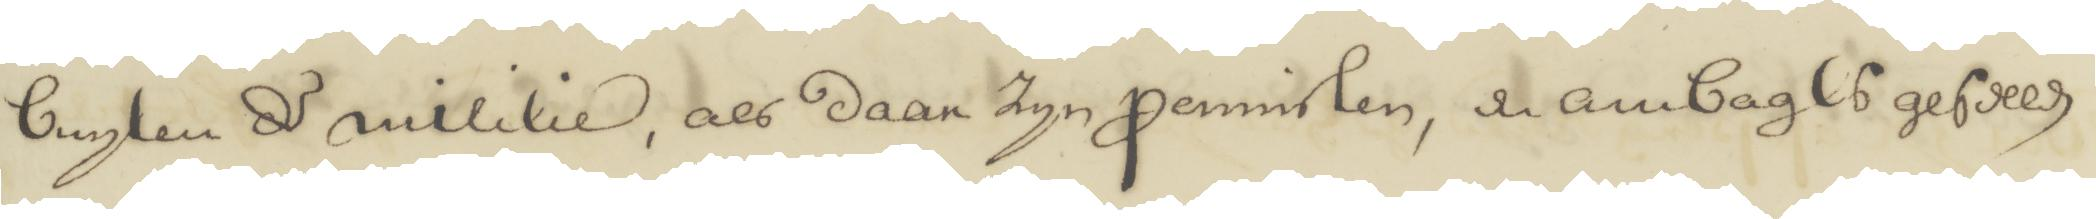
buyten de militie, als daar zyn pennisten, en ambagts gesellen
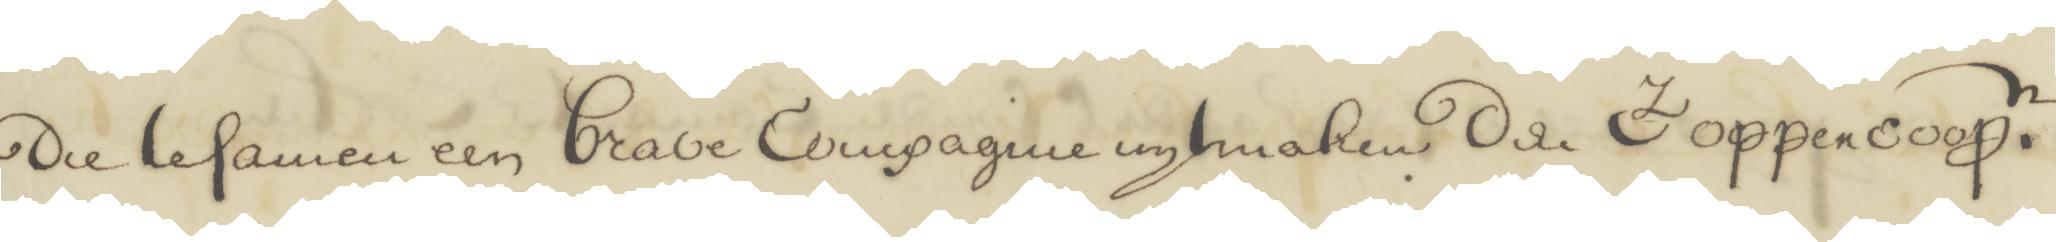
die te samen een brave Compagnie uytmaken den E opper coop.n
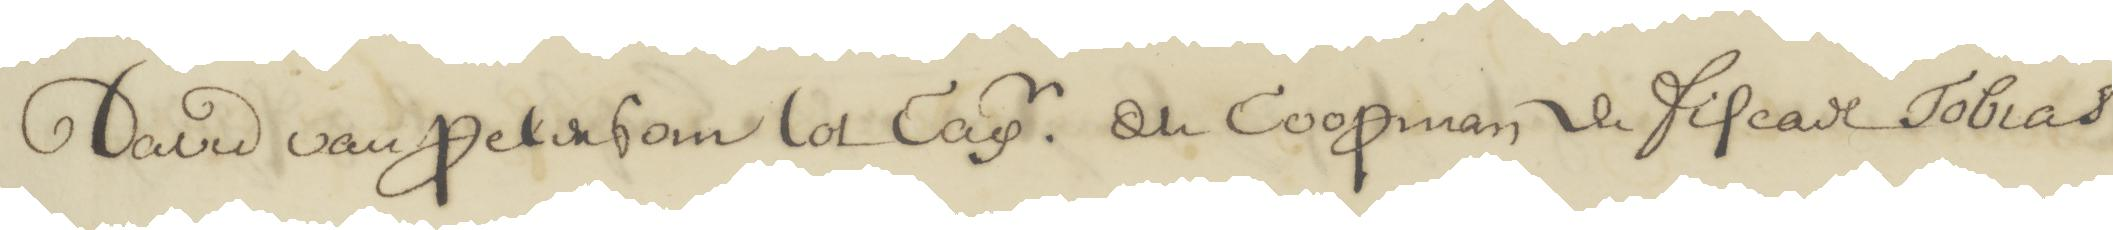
David van Petersom tot Cap.n den Coopman en fiscael Tobias
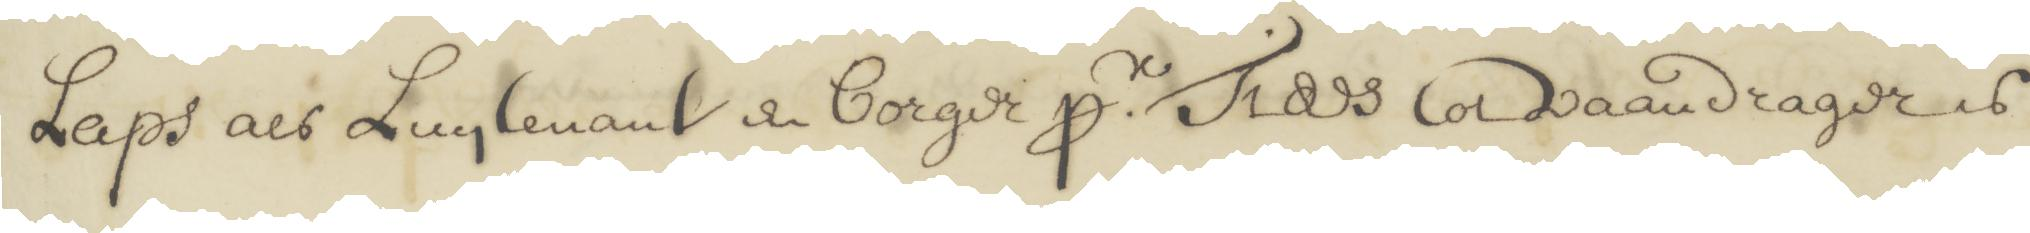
Laps als Luytenant en borger p.r Tides tot vaandrager is
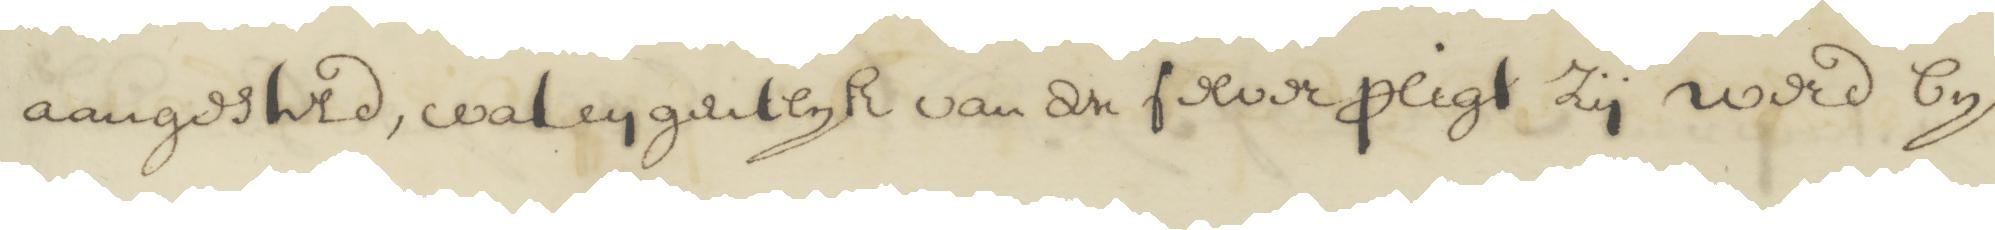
aangesteld, wat eygentlyk van der selver pligt zij werd by
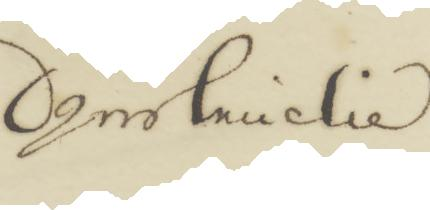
Djnstructie
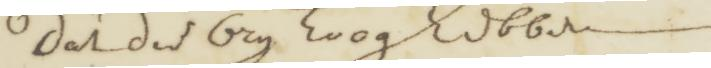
dat den bry hoog hebben
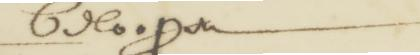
beloopen
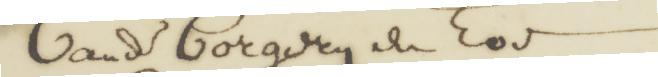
van de borgery en hoe
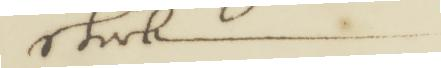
sterk
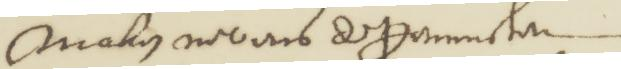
maken nevens de pennisten
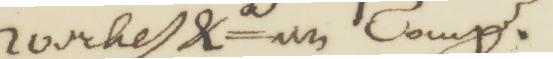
werkelijk &=a en Comp:s
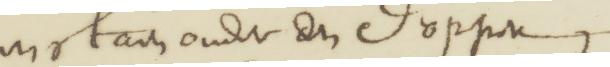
en staen onder den E opper
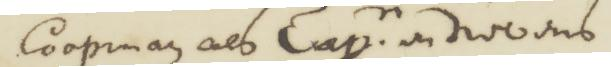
Coopman als Cap.n en nevens
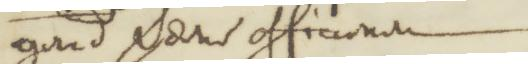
gende verdere officieren
